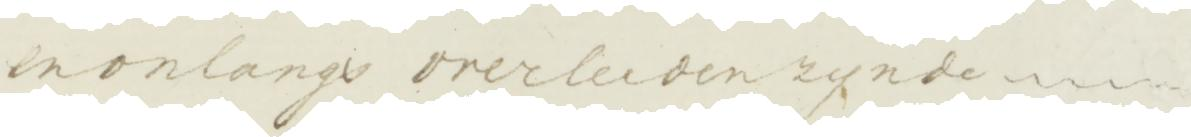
en onlangs overleeden zijnde
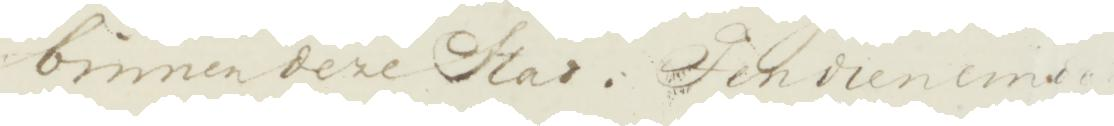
binnen deze Stad. Ten dien einde
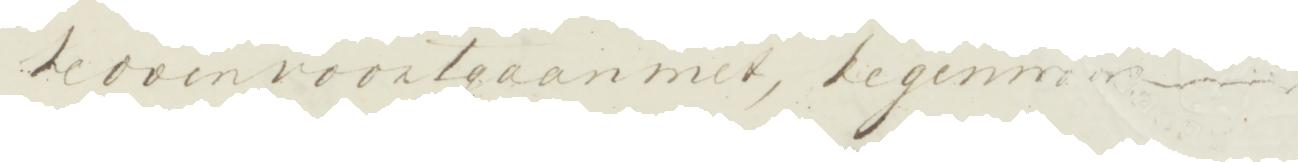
te doen voortgaan met, tegenwoor
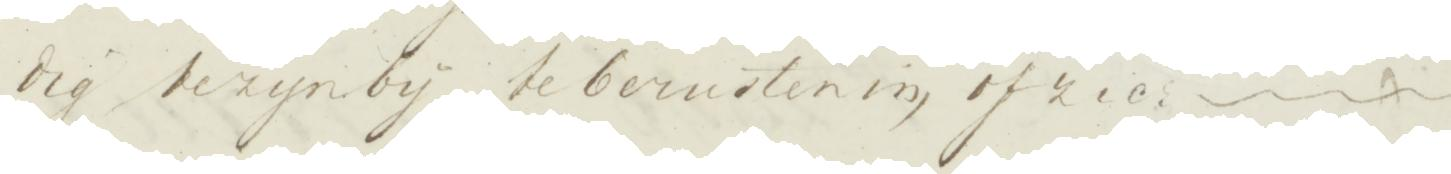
dig tezijn bij, te berusten in, of zich
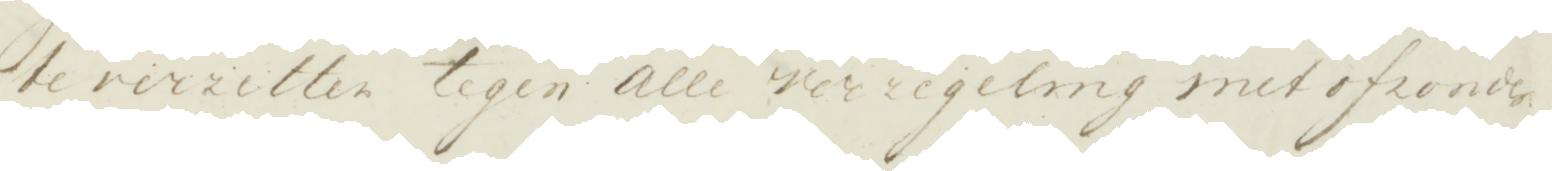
te verzetten tegen alle verzegeling met of zonder
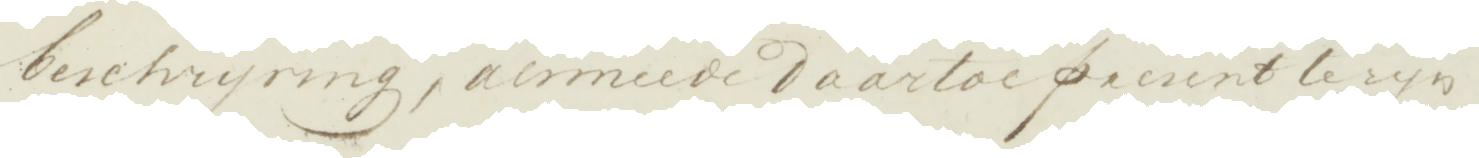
beschrijving, alsmeede daartoe present te zijn
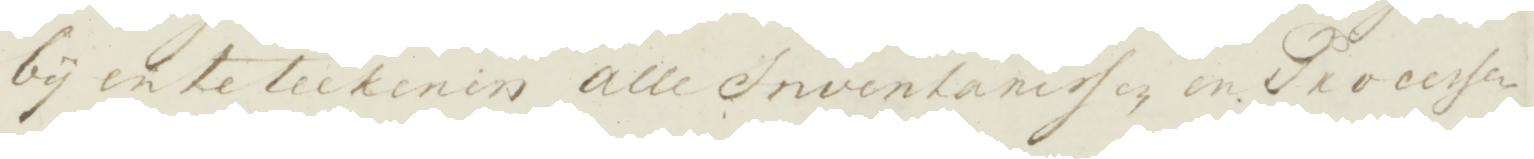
bij en te teekenen alle Inventarissen en Processen
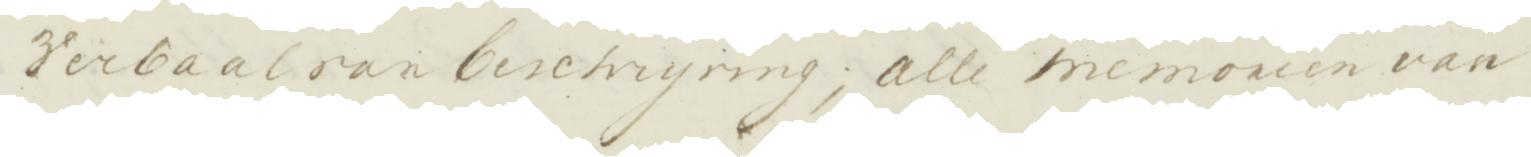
Verbaal van beschrijving; alle memorien van
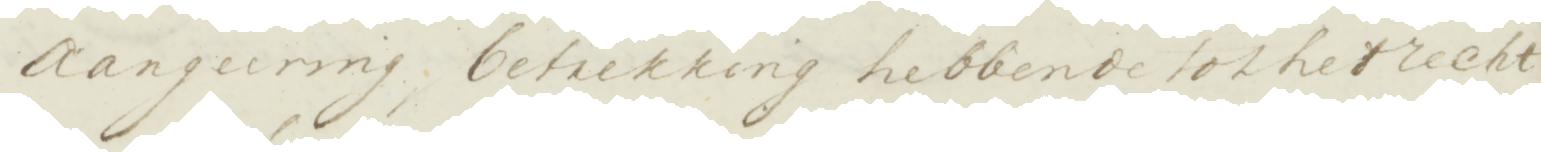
Aangeeving, betrekking hebbende tot het recht
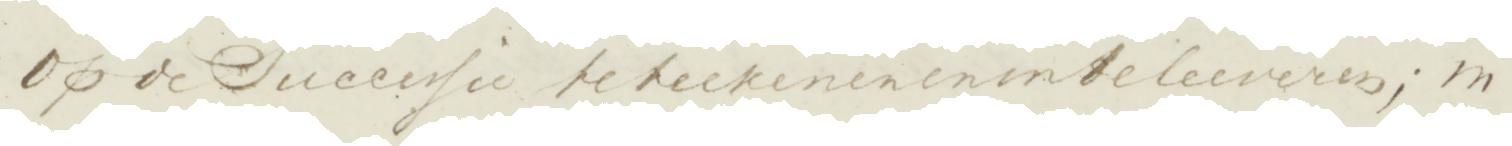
op de Successie te teekenen en in te leeveren; in
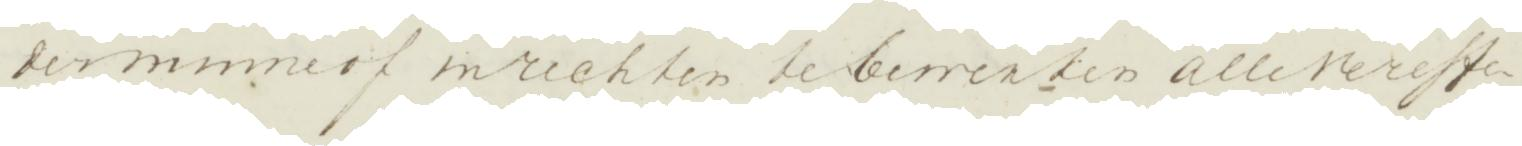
der minne of inrechten te bewerken alle vereffen
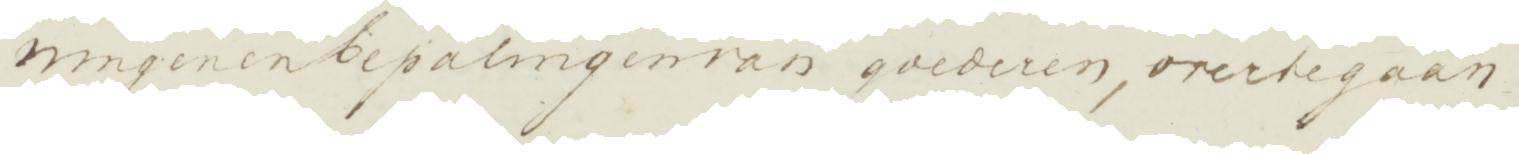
ningen en bepalingen van goederen, over tegaan
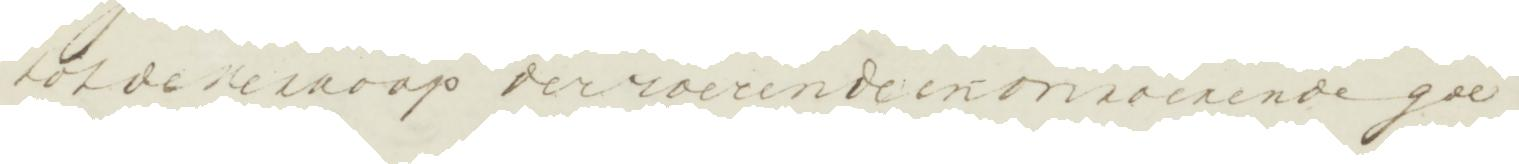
tot de verkoop der roerende en onroerende goe
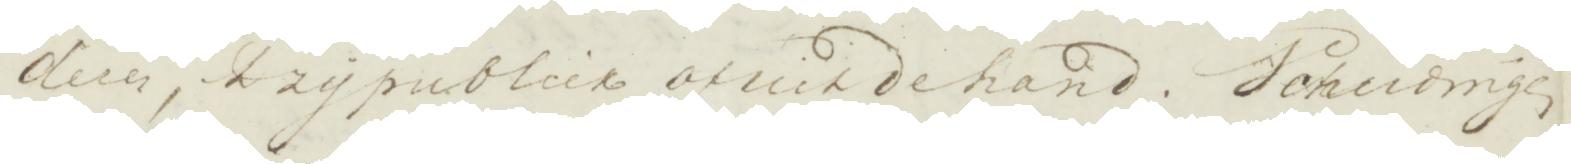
deren, t zij publiek of uit de hand. Scheidingen
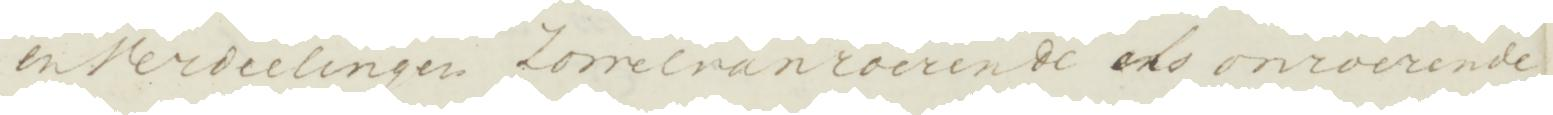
en verdeelingen zowel van roerende als onroerende
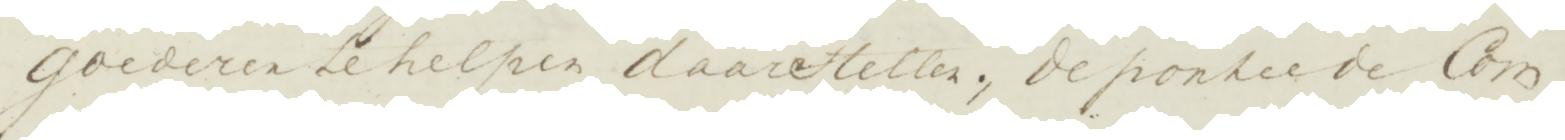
goederen te helpen daarstellen, de portie de Com
